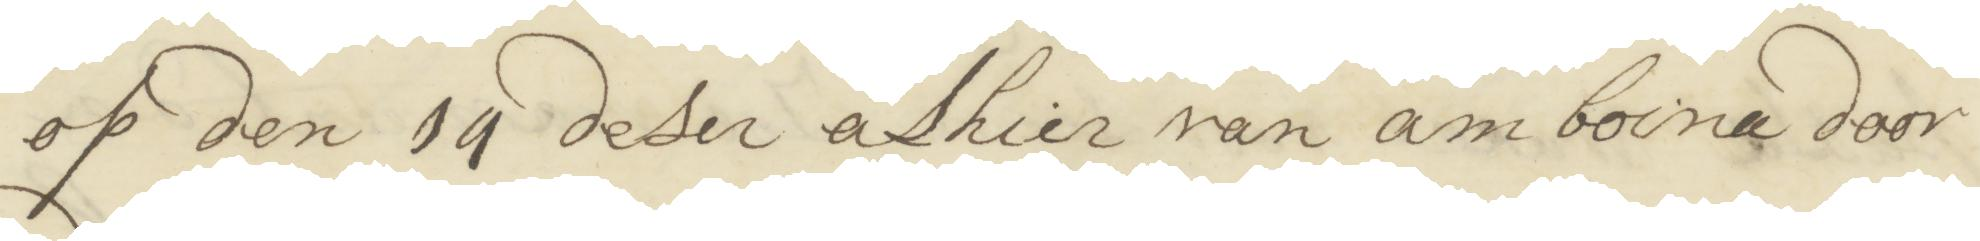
op den 14 deser alhier van amboina door
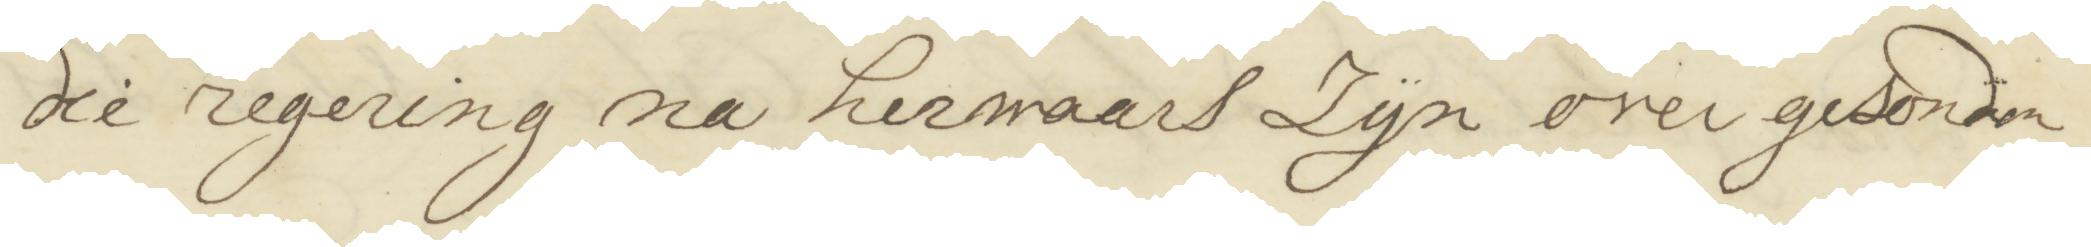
die regering na herwaars zijn over gesonden
